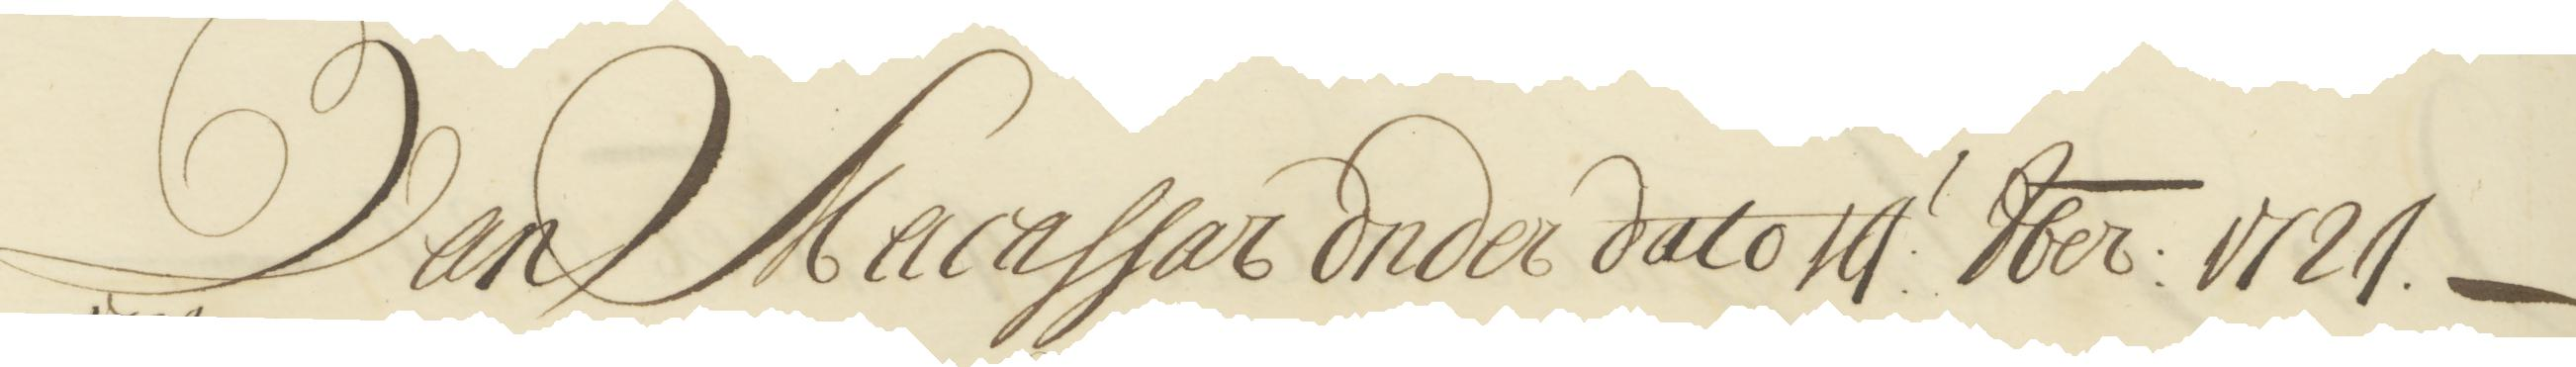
Van Macassar onder dato 14:' 8ber: 1724. —
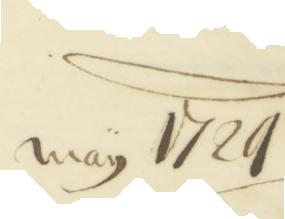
maij 1724
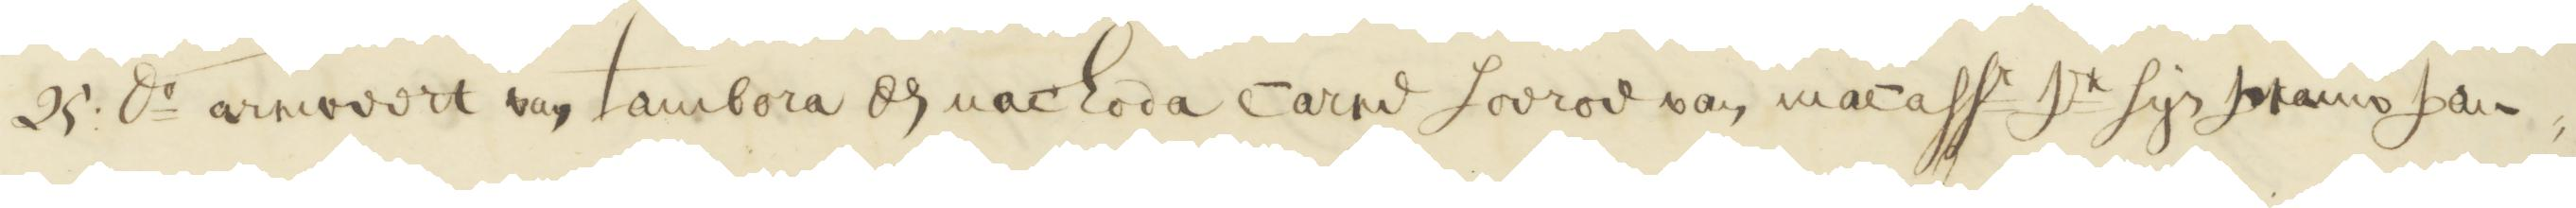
25: d=o arriveert van tambora den nachoda carne Soeroe van macass=r P=r sijn prauw pan„
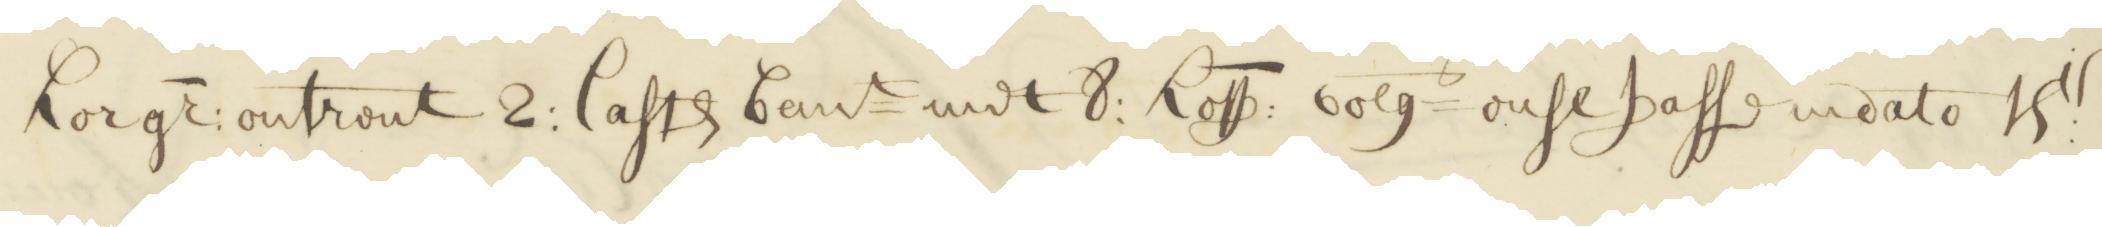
kor gr: ontrent 2: lasten bem=t met 8: kopp: volg=' onse passe in dato 15:''
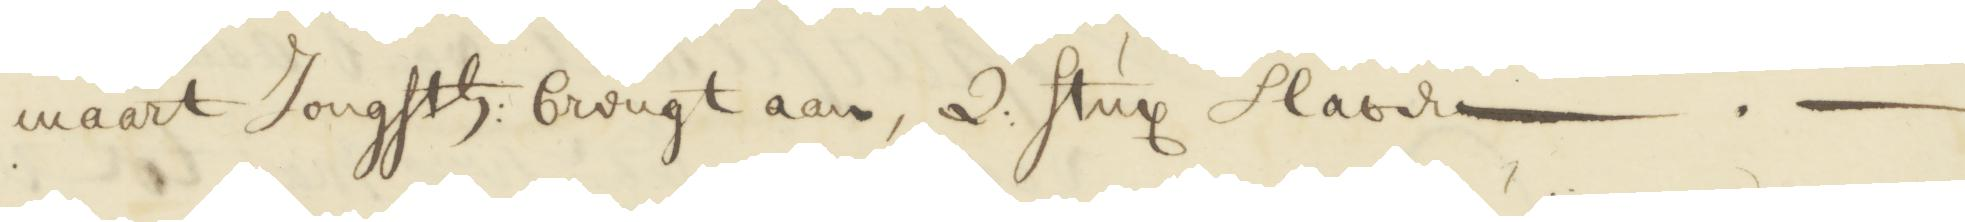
maart Iongstl: brengt aan, 2: stux slaven —.—
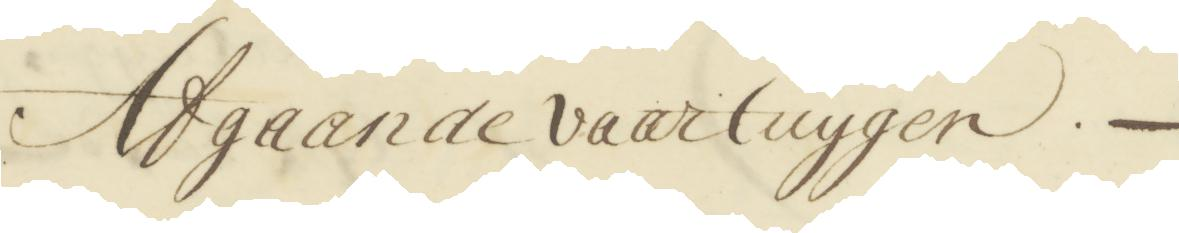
Afgaande vaartuijgen. —
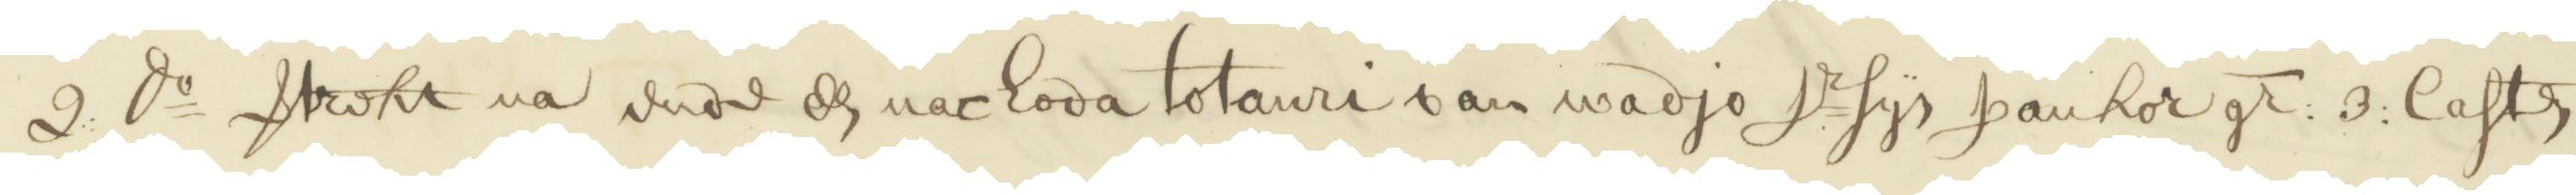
2: d=o vertrekt na ende den nachoda totauri van wadjo p=r sijn pankor gr: 3: lasten
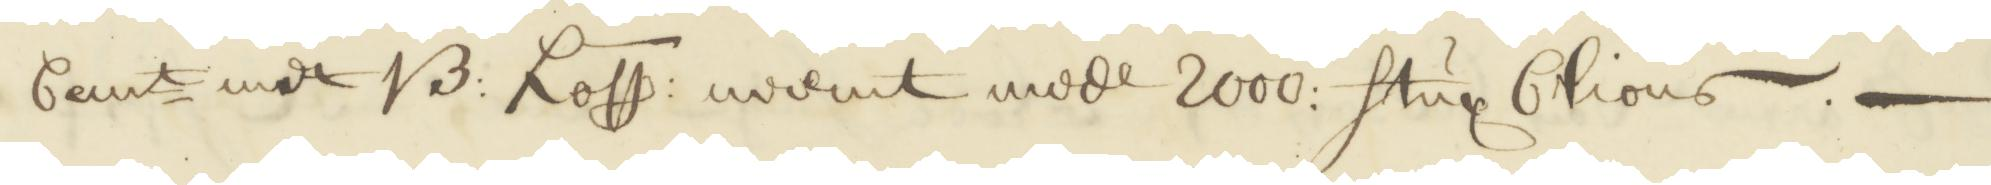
bem=t met 13: Kopp: neemt mede 2000: stux blions. —
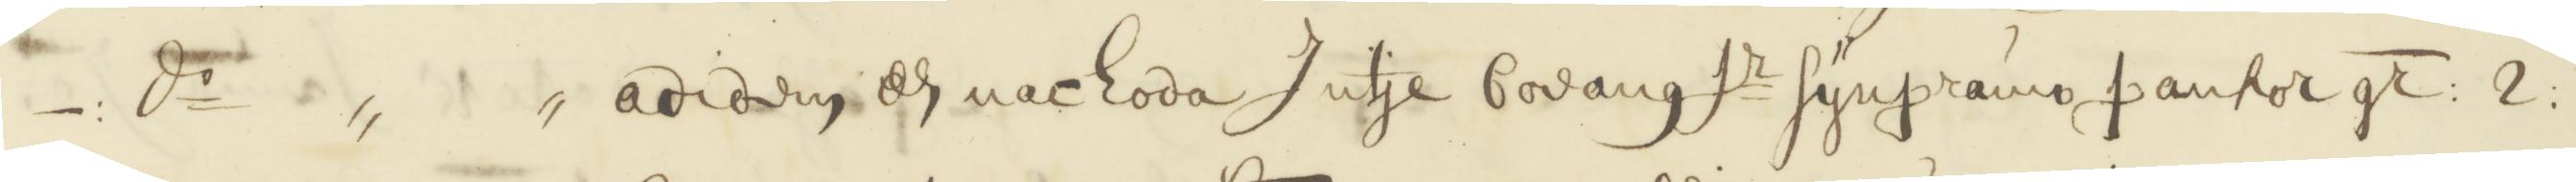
—: d=o „ „ adidem den nachoda Jntje boeang P=r sijn prauw pankor gr: 2:
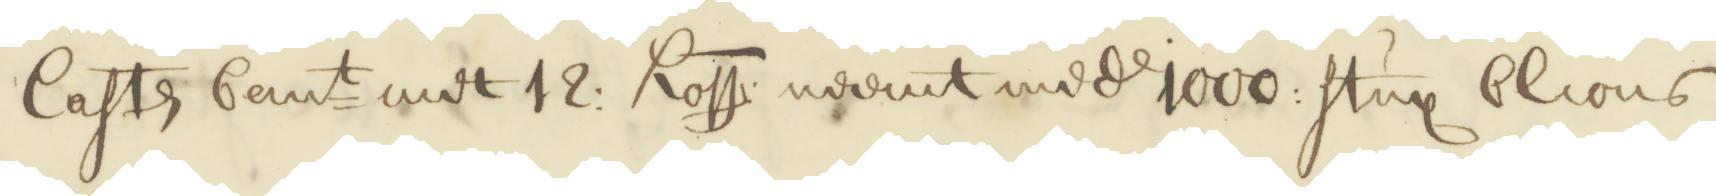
lasten bem=t met 12: kopp: neemt mede 1000: stux blions
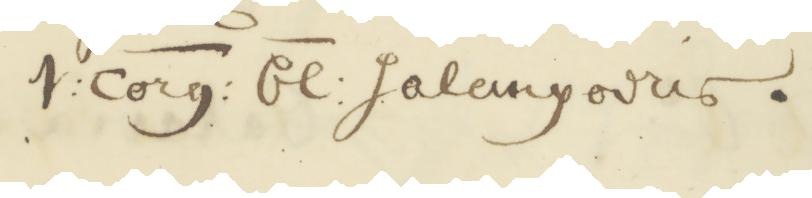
1: Corg: bl: Salempoeris.
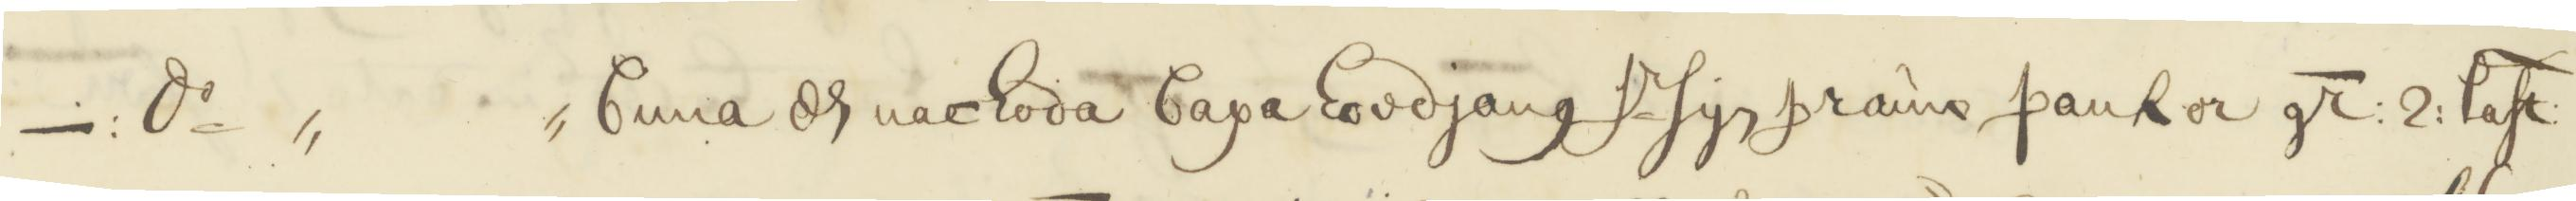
—: d=o„ „ bima den nachoda bapa hoedjang p=r sijn prauw pankor gr: 2: last:
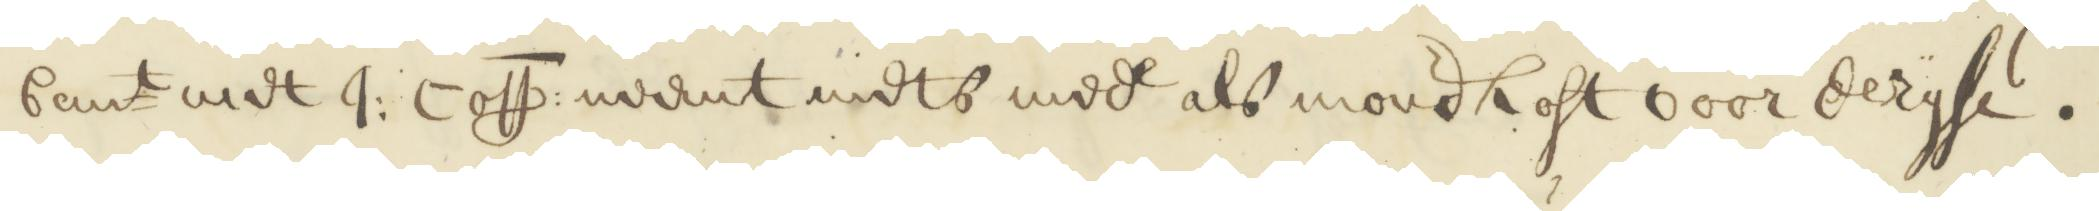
bem=t met 4: Copp: neemt niets mede als mondkost voor de rijse.
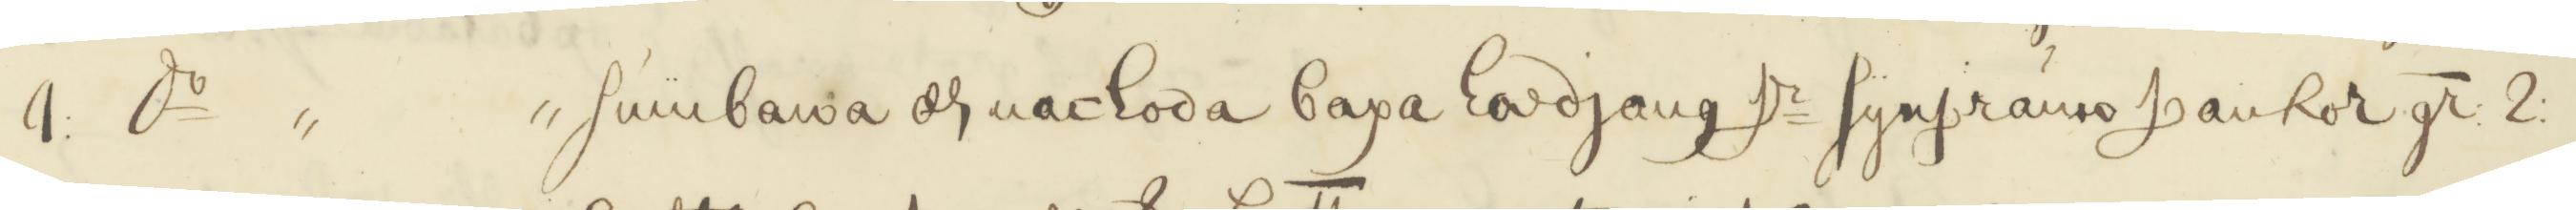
4: d=o „ „ sumbawa den nachoda bapa hoedjang p=r sijn prauw pankor gr: 2:
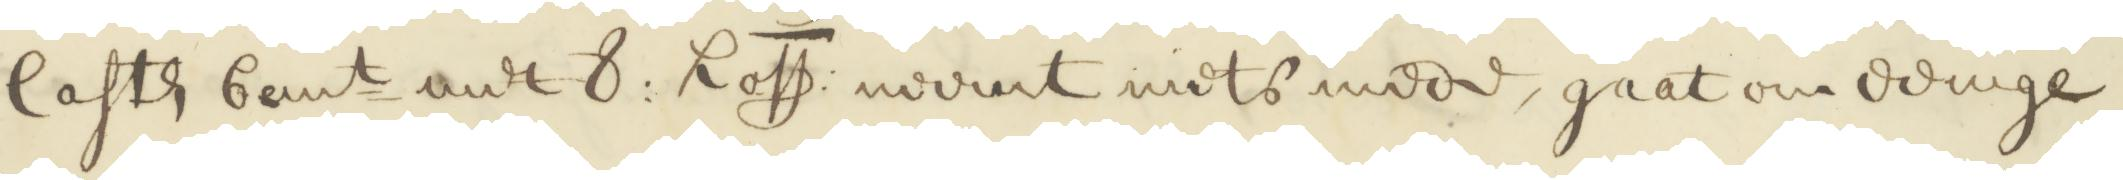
lasten bem=t met 8: kopp: neemt niets mede, gaat om eenige
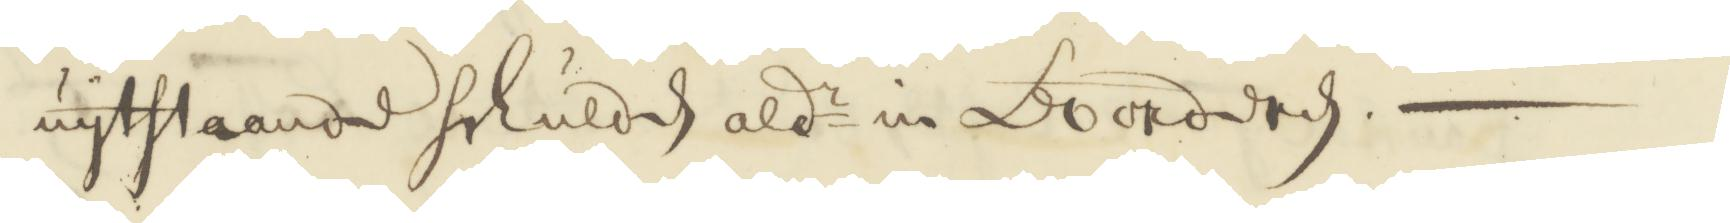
uijtstaande schulden ald=r in tevorderen.—
